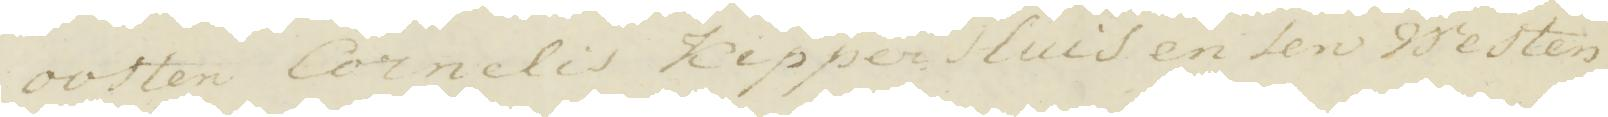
oosten Cornelis kippersluis en ten Westen
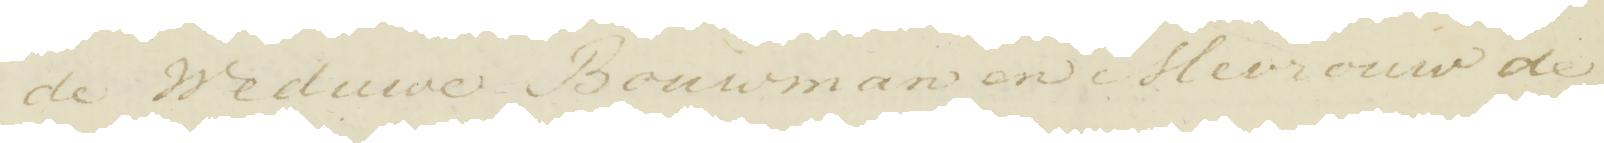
de Weduwe Bouwman en Mevrouw de
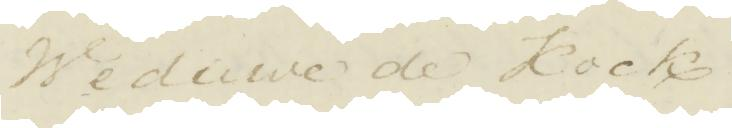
Weduwe de Kock
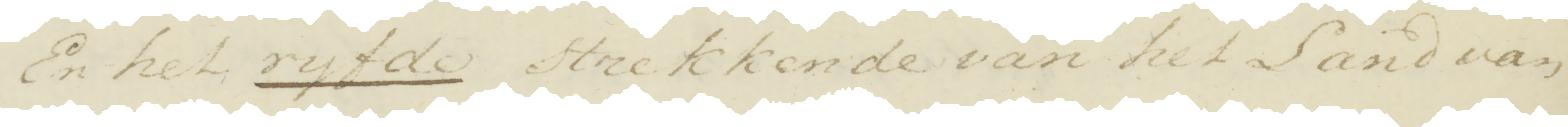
En het vyfde strekkende van het Land van
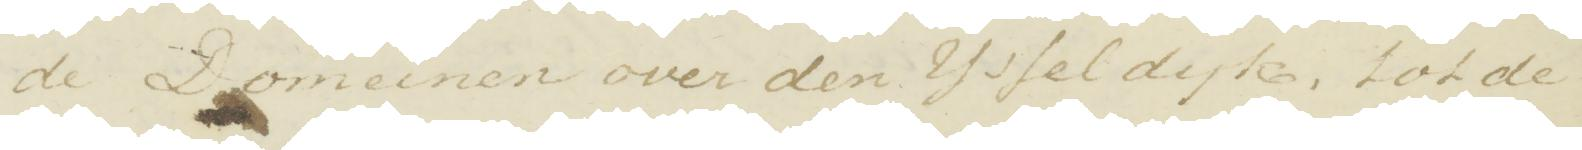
de Domeinen over den Ysseldyk, tot de
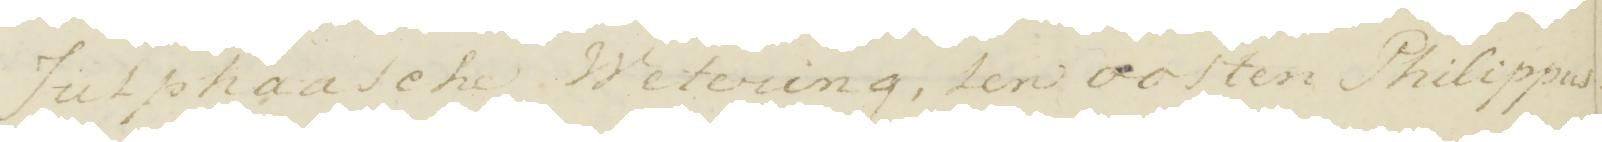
Jutphaasche Wetering, ten oosten Philippus
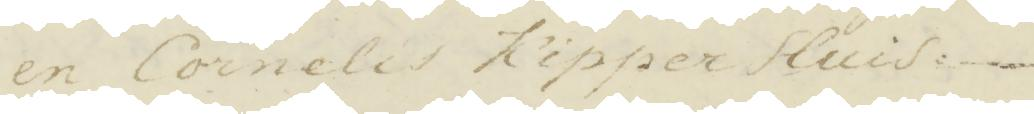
en Cornelis Kippersluis.
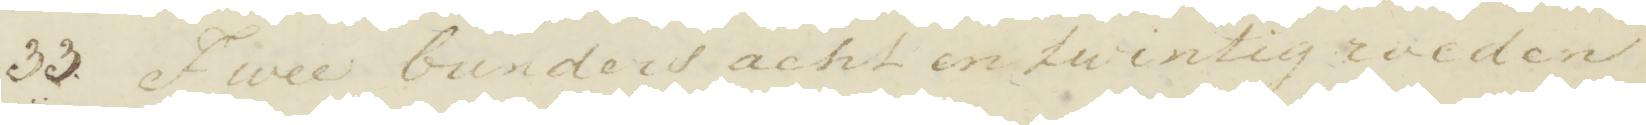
33. Twee bunders acht en twintig roeden
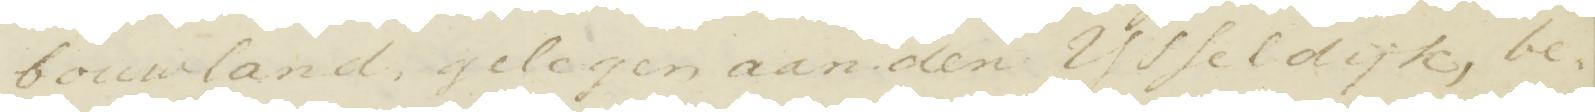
bouwland, gelegen aan den Ysseldijk, be„
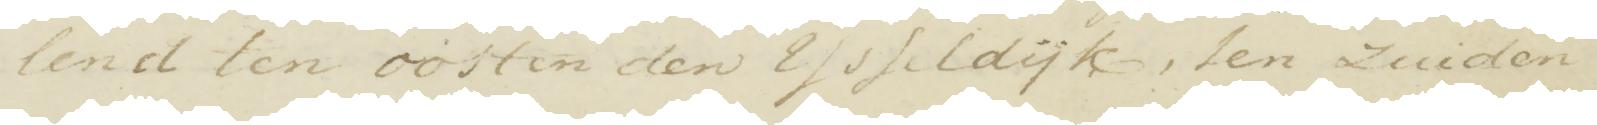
lend ten oosten den Ysseldijk, ten zuiden
